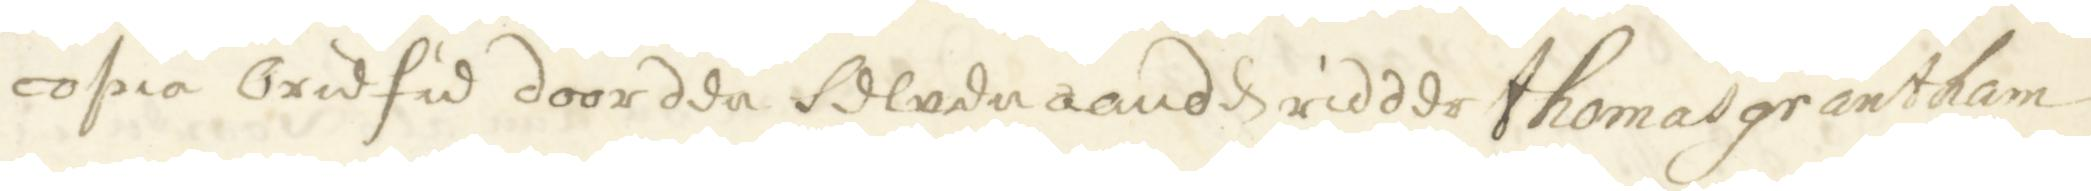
copia briefie door den selven aanden ridder thomas grantham
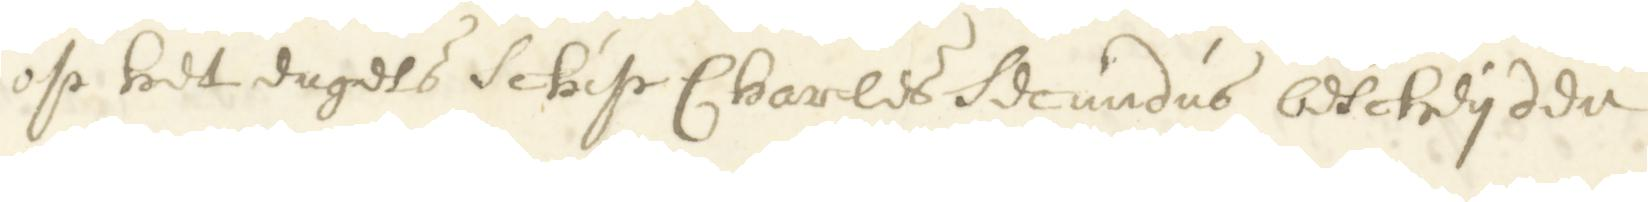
op het engels schip Charles secundus bescheijden
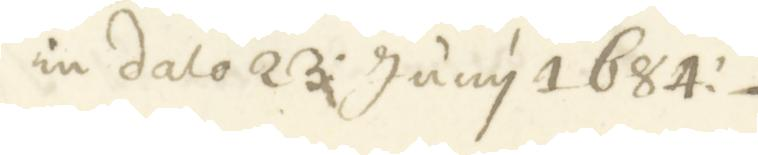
in dato 23: Junij 1684:
